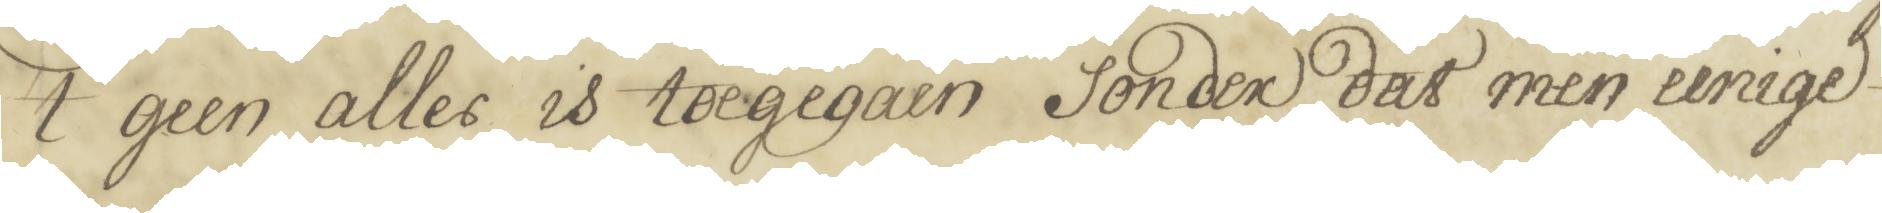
’t geen alles is toegegaen sonder dat men eenige
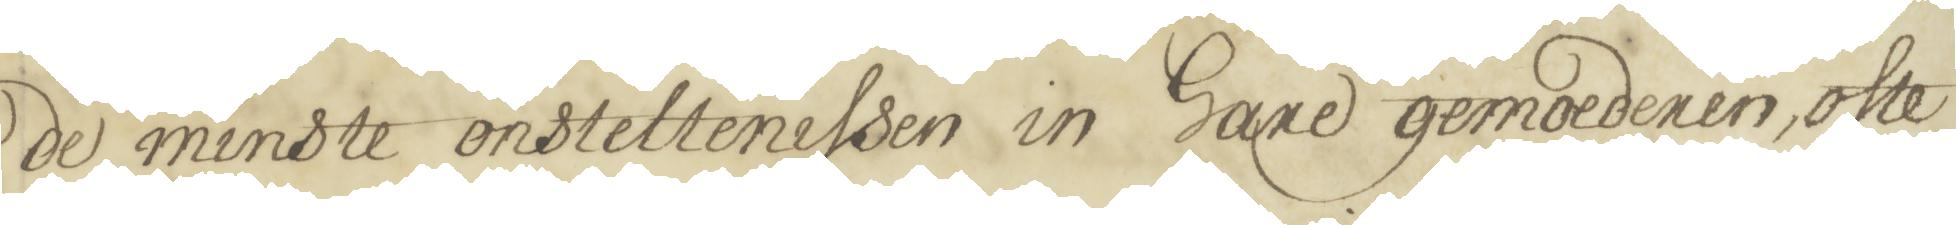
de minste onsteltenissen in hare gemoederen, ofte
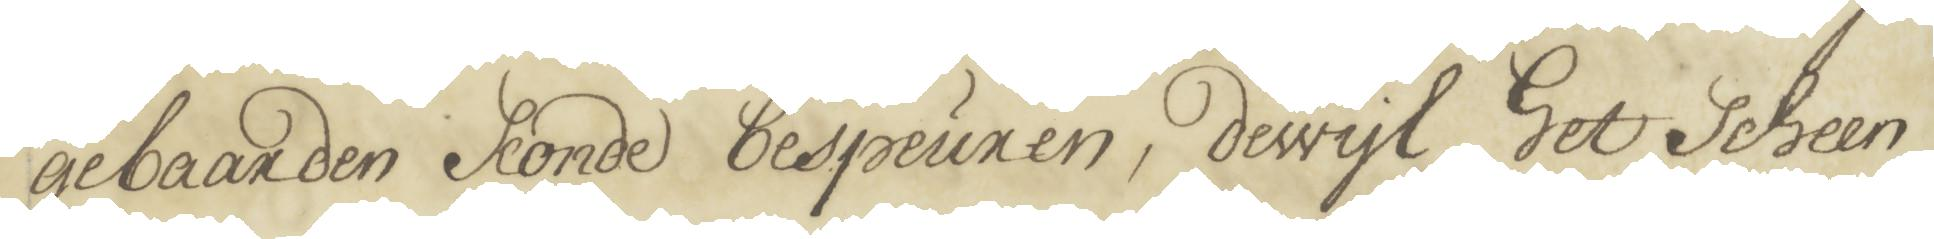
gebaarden konde bespeuren, dewijl het scheen
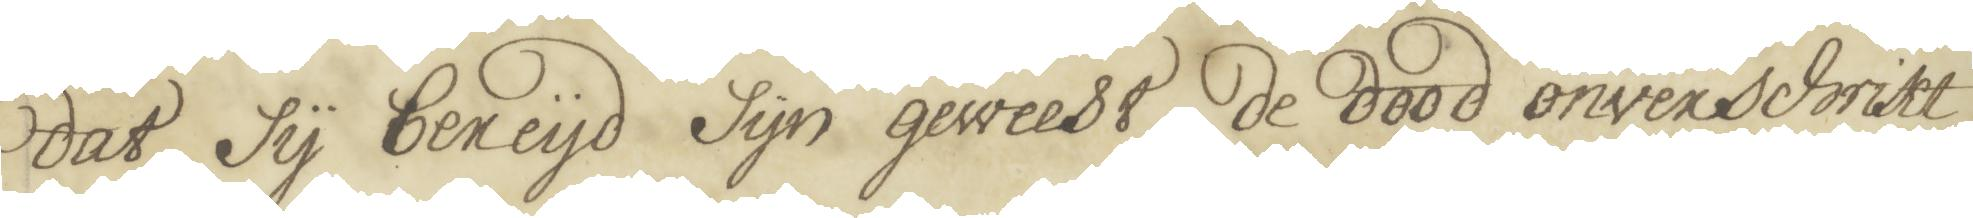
dat sij bereijd sijn geweest de dood onverschrikt
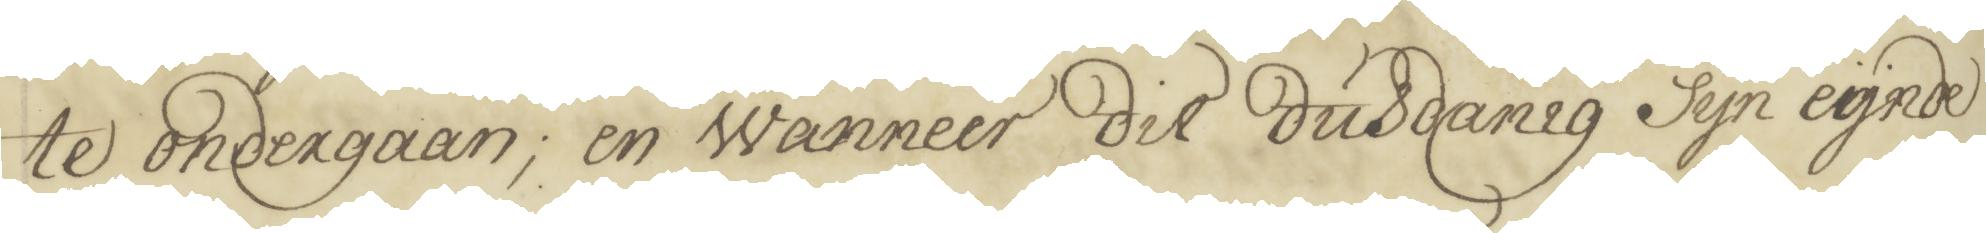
te ondergaan; en wanneer dit dusdanig sijn eijnde
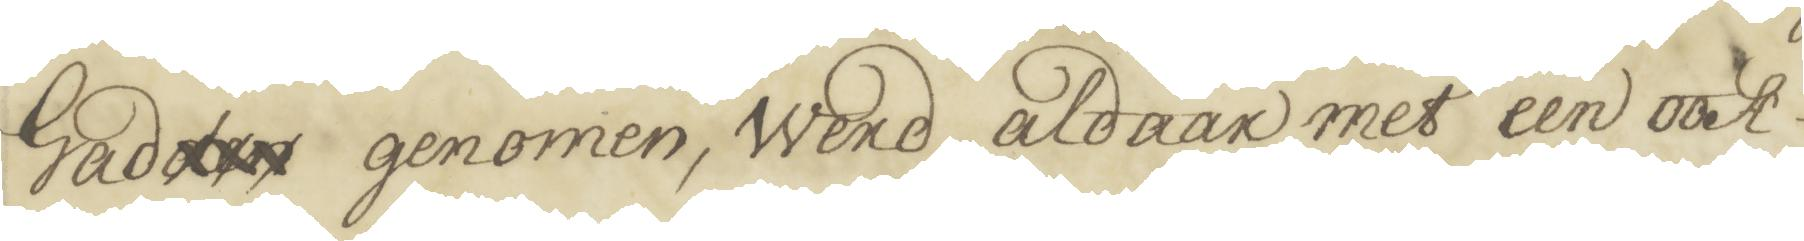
had genomen, werd aldaar met een ook
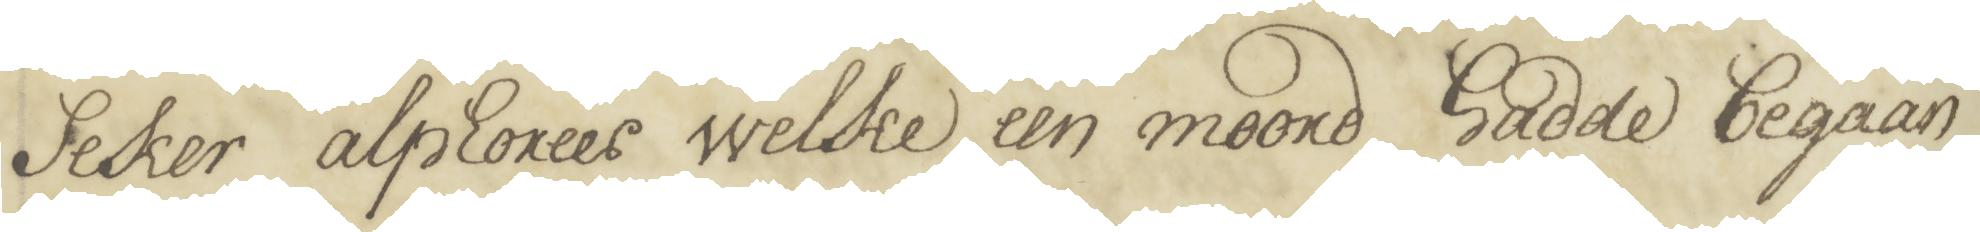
Seker alphorees welke een moord hadde begaan
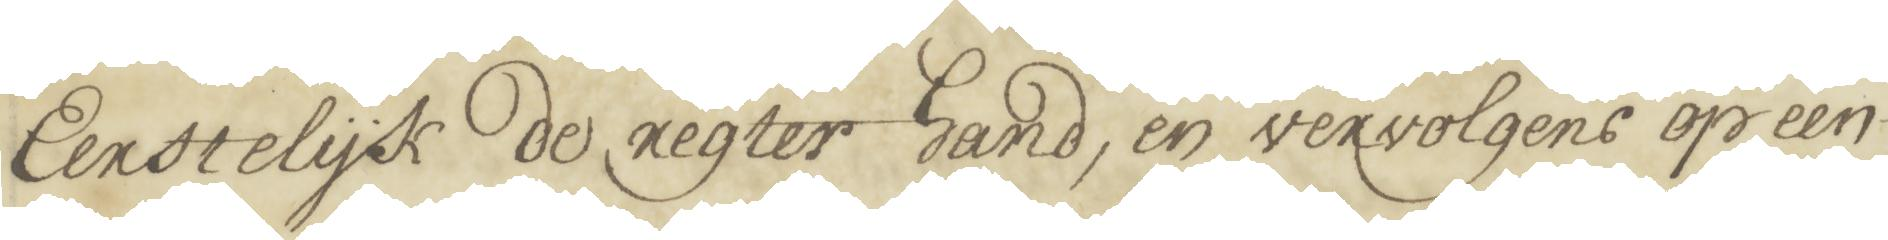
Eerstelijk de regter hand, en vervolgens op een
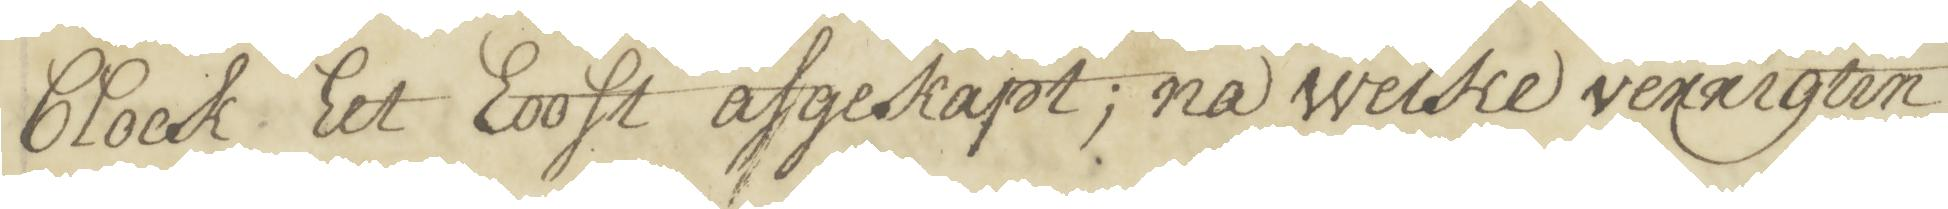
block het hooft afgekapt; na welke verrigtin
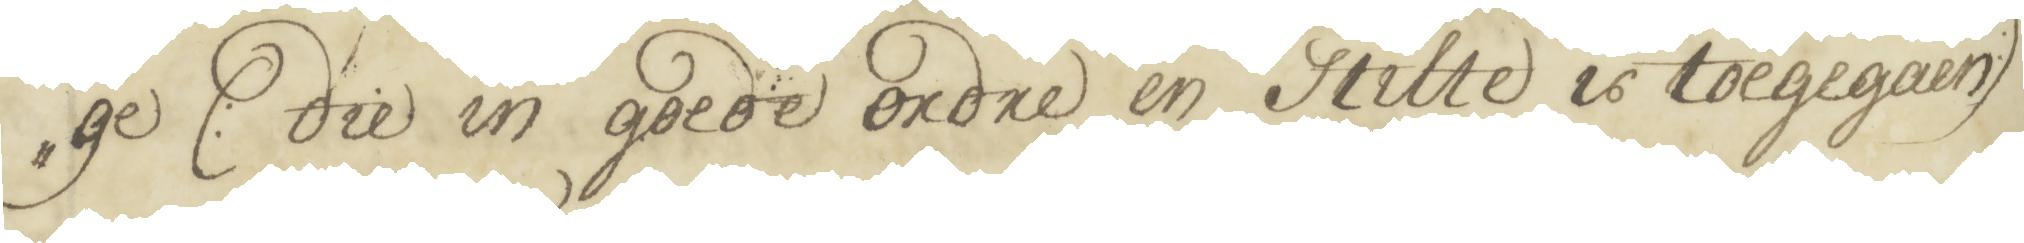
„ge (: die in goede ordre en stilte is toegegaen)
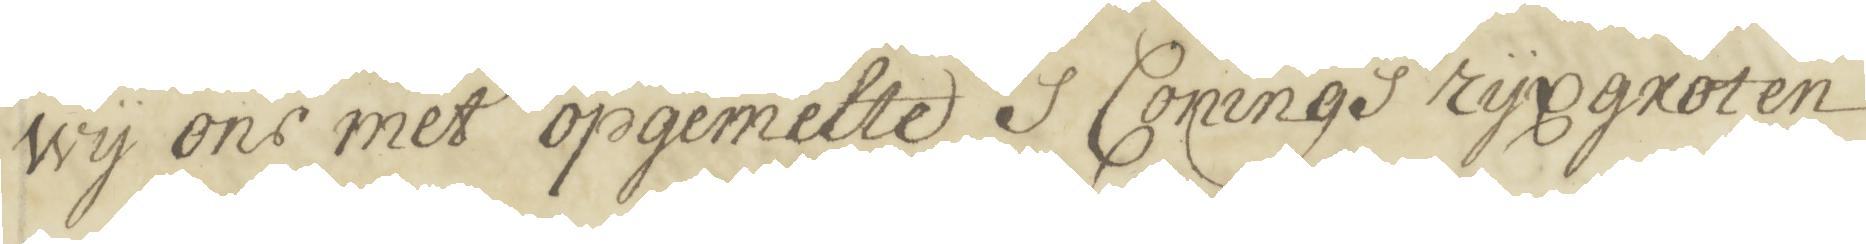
wij ons met opgemelte 's Conings rijxgroten
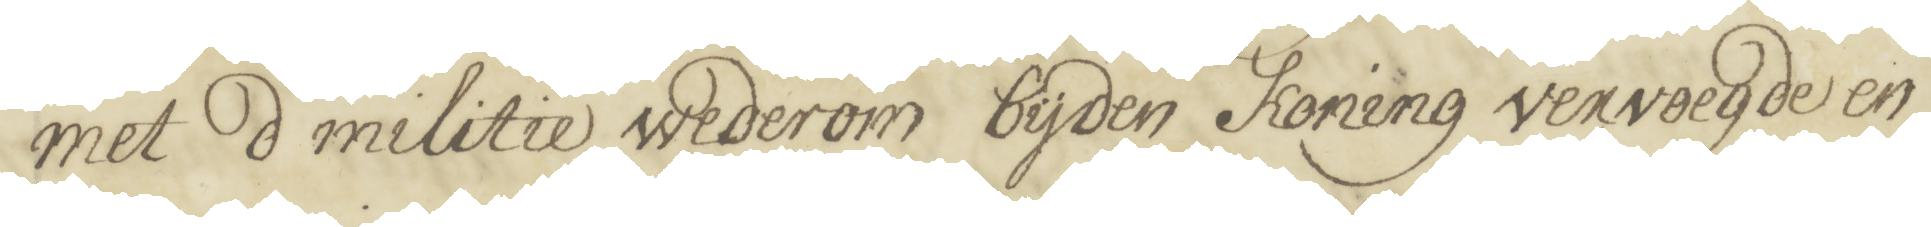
met d'militie wederom bijden koning vervoegde en
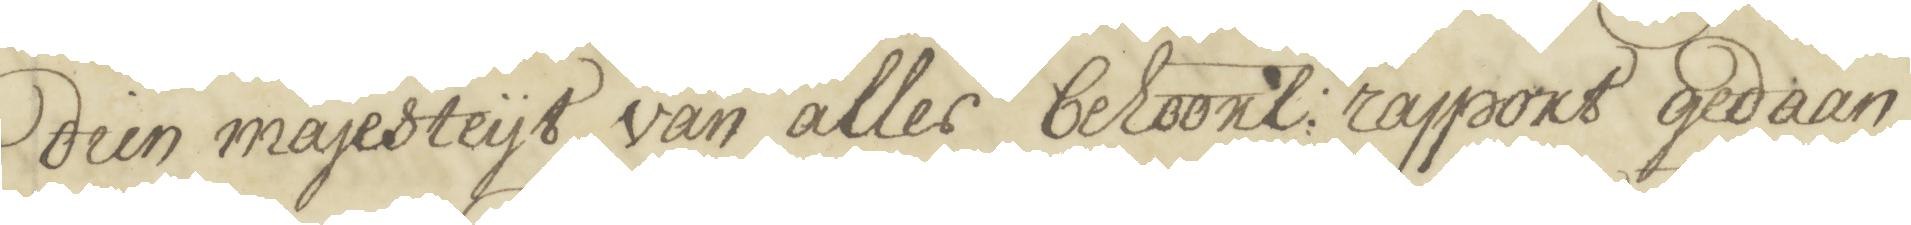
dien majesteijt van alles behoorl: rapport gedaan
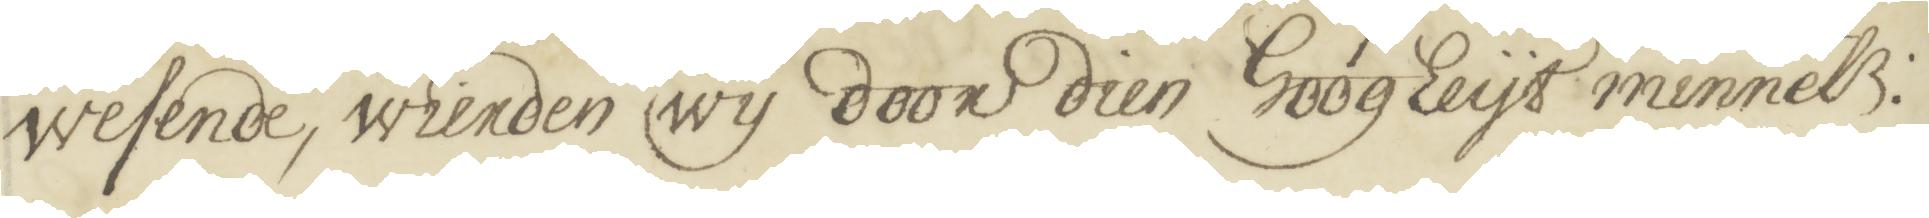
wesende, wierden wij door dien hoogheijt minnelijk
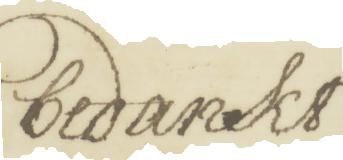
bedankt
